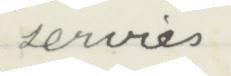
servies
